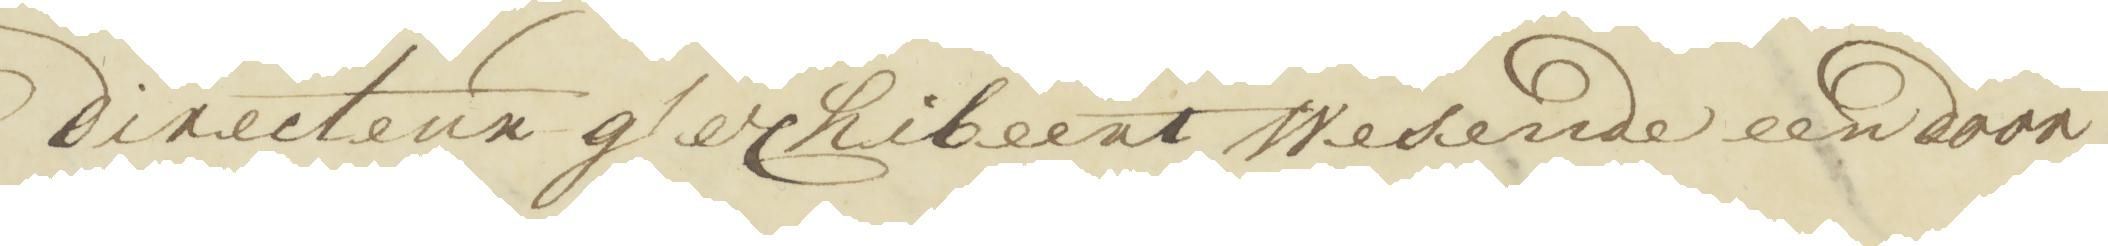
directeur g’exhibeert wesende een door
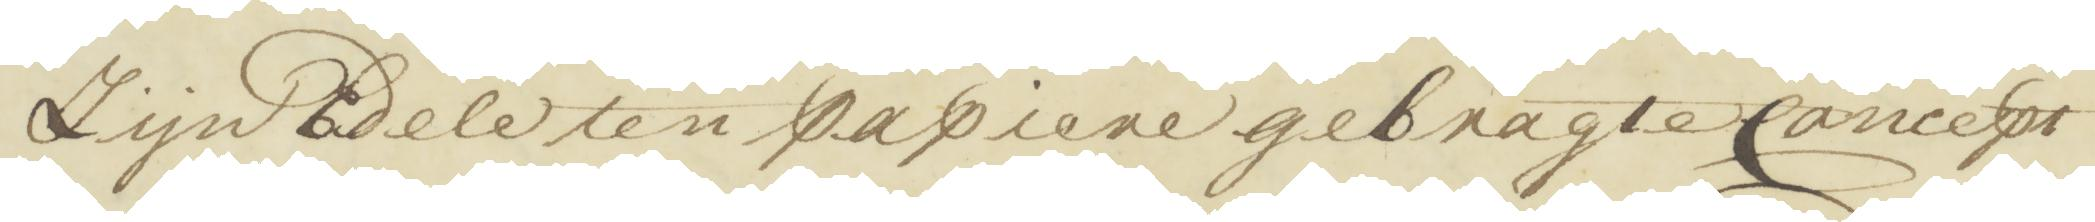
Zijn Edele ten papiere gebragte concept
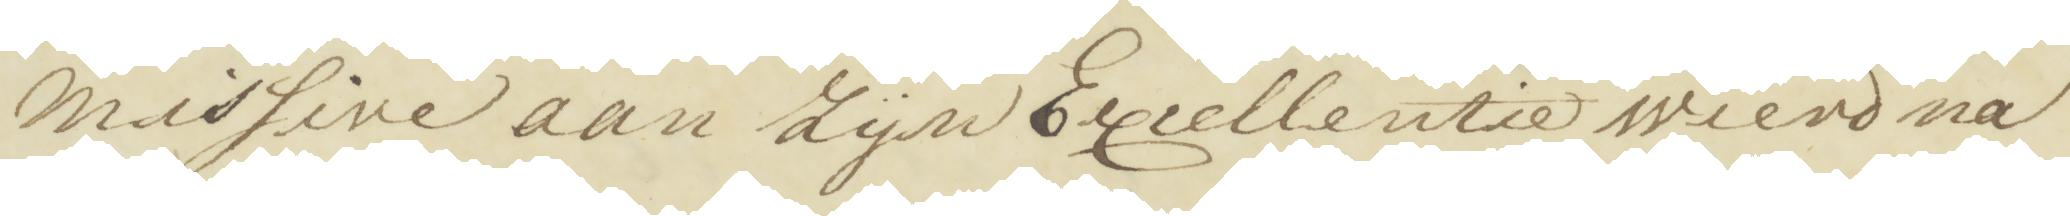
missive aan zijn Excellentie wierd na
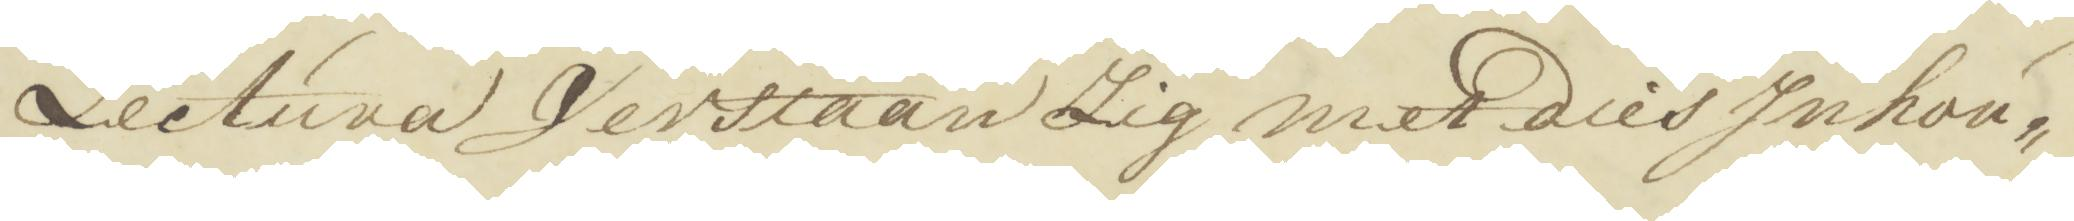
Lectura Verstaan Zig met dies Jnhou„
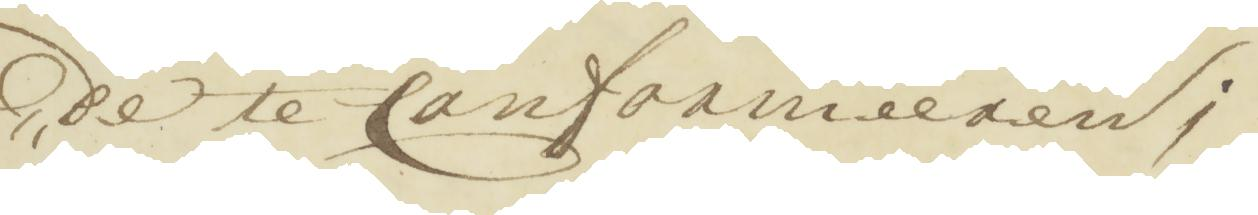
„de te conformeeren;
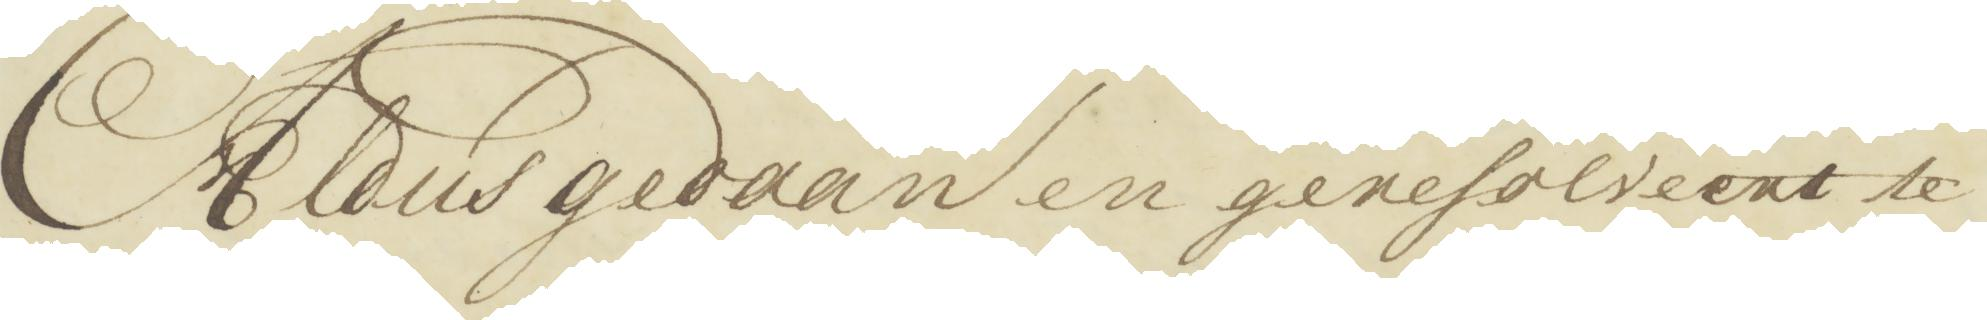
Aldus gedaan en geresolveert te
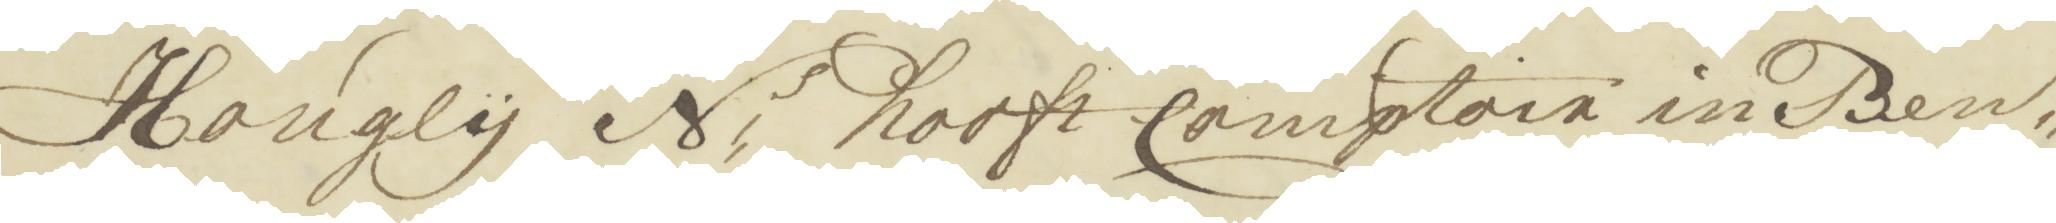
Houglij N„s hooft comptoir in Ben„
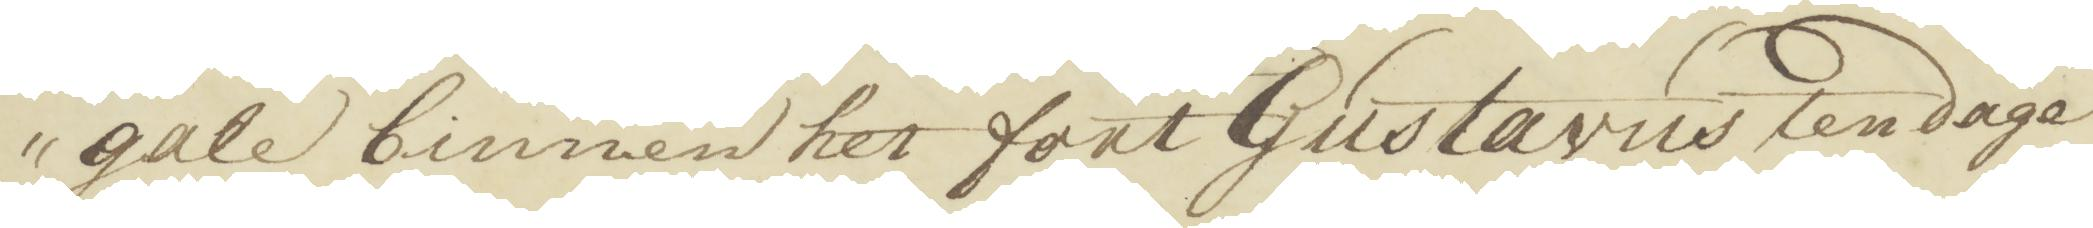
„gale binnen het fort Gustavus ten dage
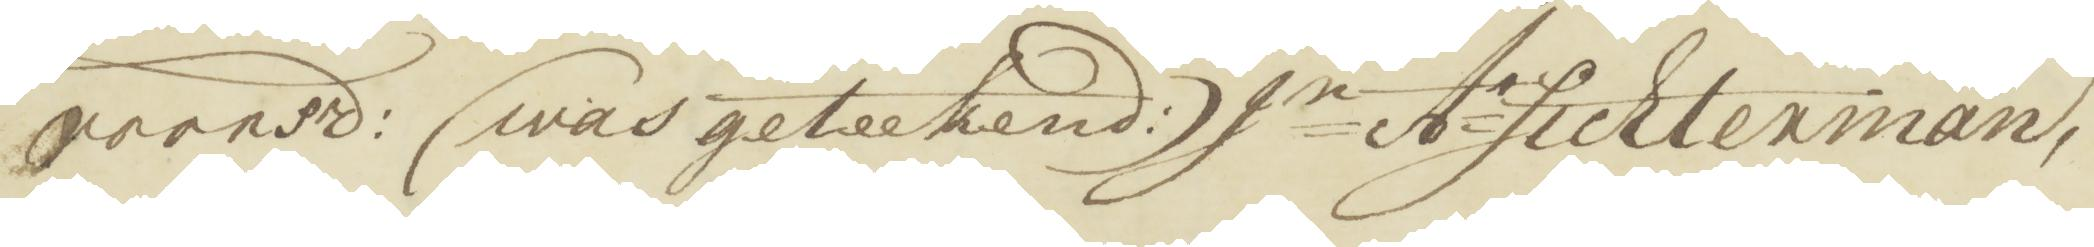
voorsz: (was geteekend:) J=n A=t Sichterman,
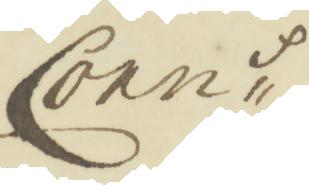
Corn„s
